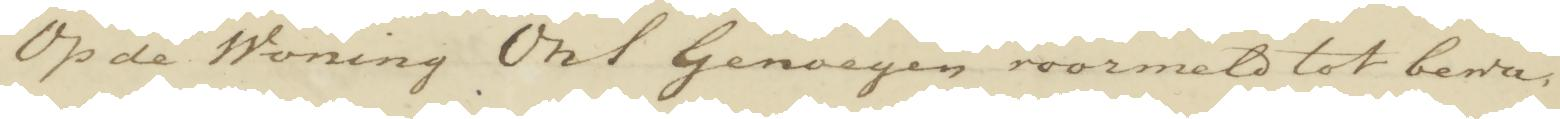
Op de Woning Ons genoegen voormeld tot bewa,
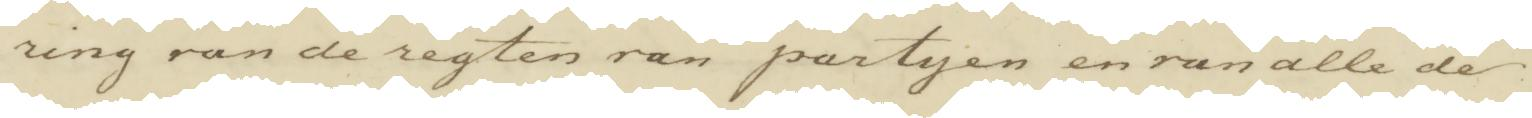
ring van de regten van partijen en van alle de
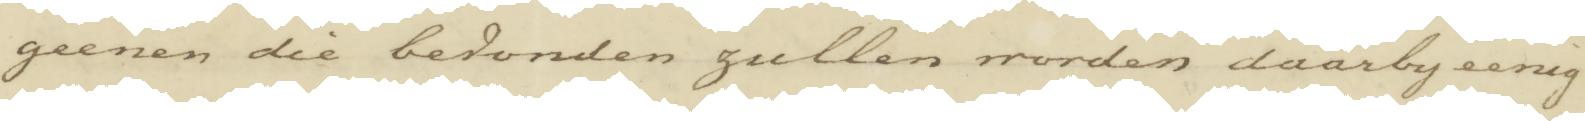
geenen die bevonden zullen worden daarby eenig
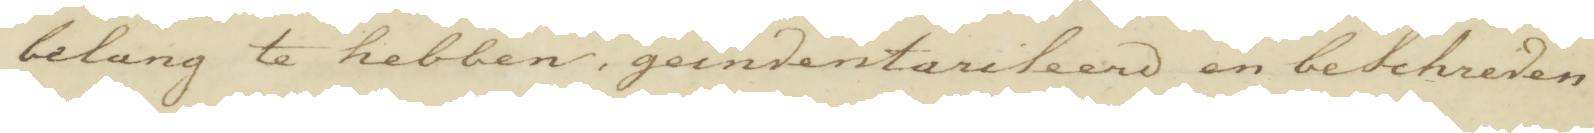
belang te hebben, geinventariseerd en beschreven
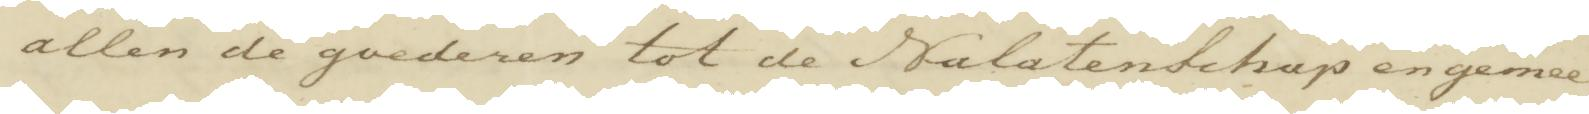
allen de goederen tot de Nalatenschap en gemee
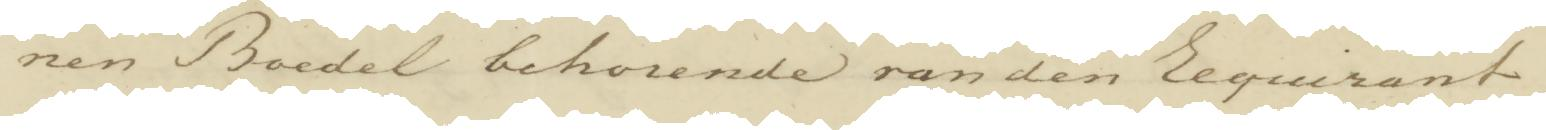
nen Boedel behorende van den requirant
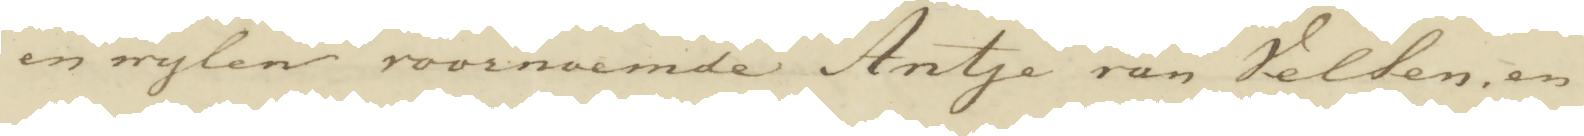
en wijlen voornoemde Antje van Velsen, en
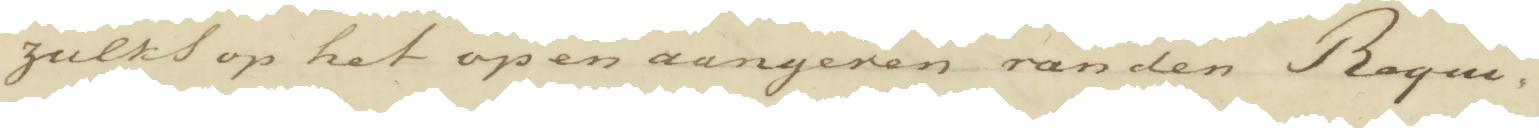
zulks op het op en aangeven van den Requi„
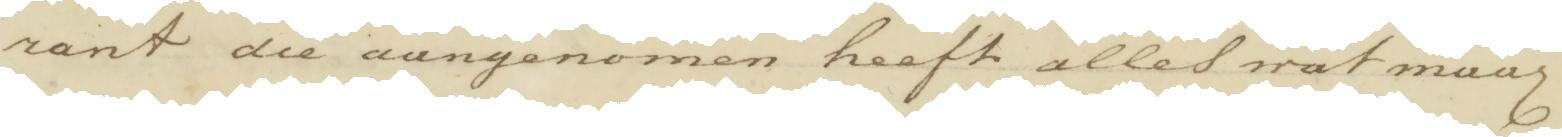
rant die aangenomen heeft alles wat maar
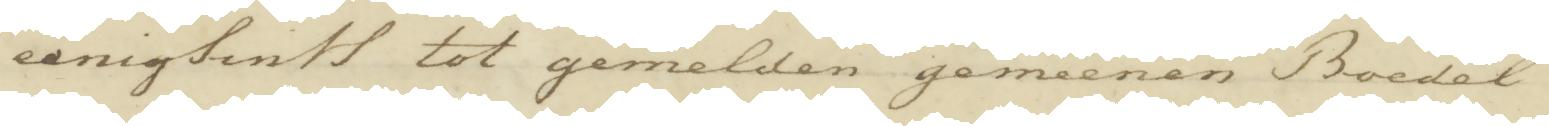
eenigsints tot gemelden gemeenen Boedel
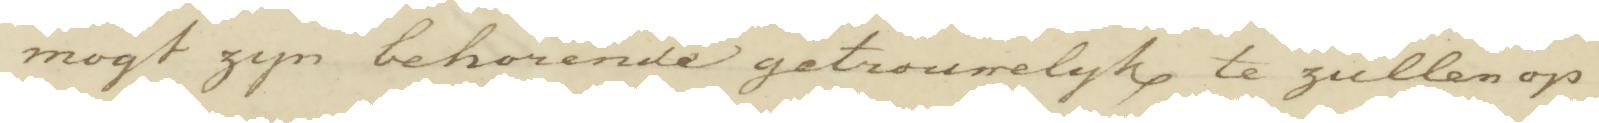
mogt zyn behorende getrouwelyk te zullen op
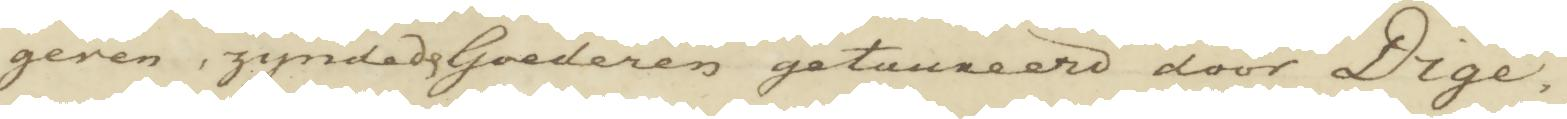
geven, zynde de Goederen getuureerd door Dige,
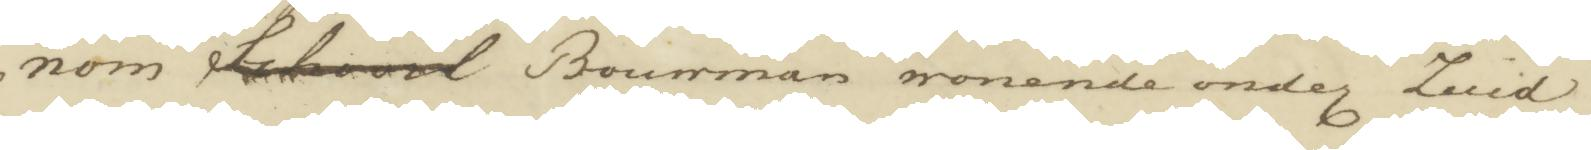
„nom Schovel Bouwman wonende onder Zuid
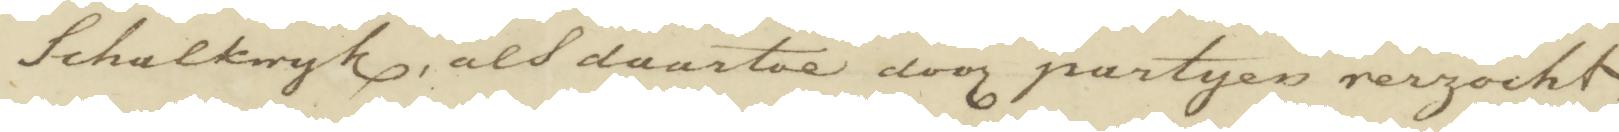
schalkwyk, als daartoe door partyen verzocht
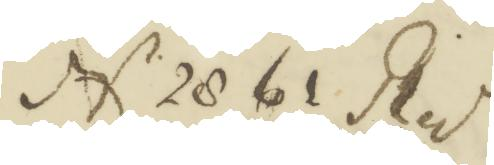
N 28 61 Rec
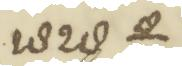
1828 8/30
